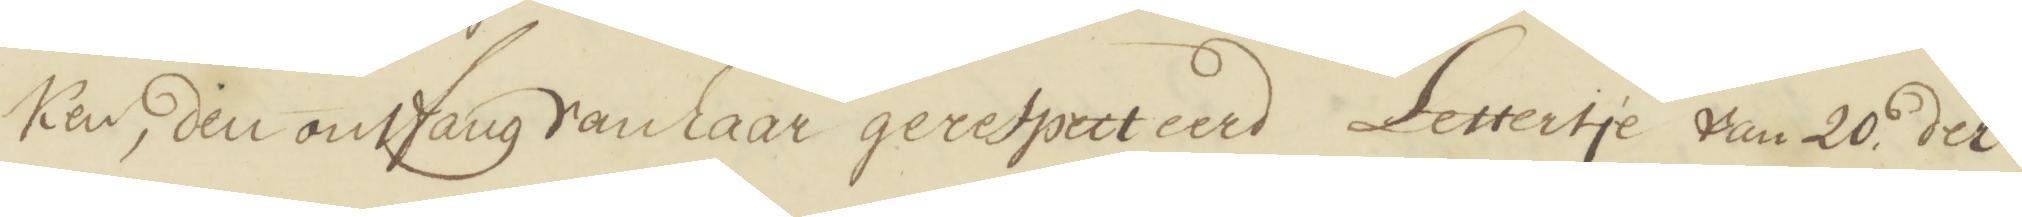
ken, den ontfang van haar gerespecteerd Lettertje van 20. der
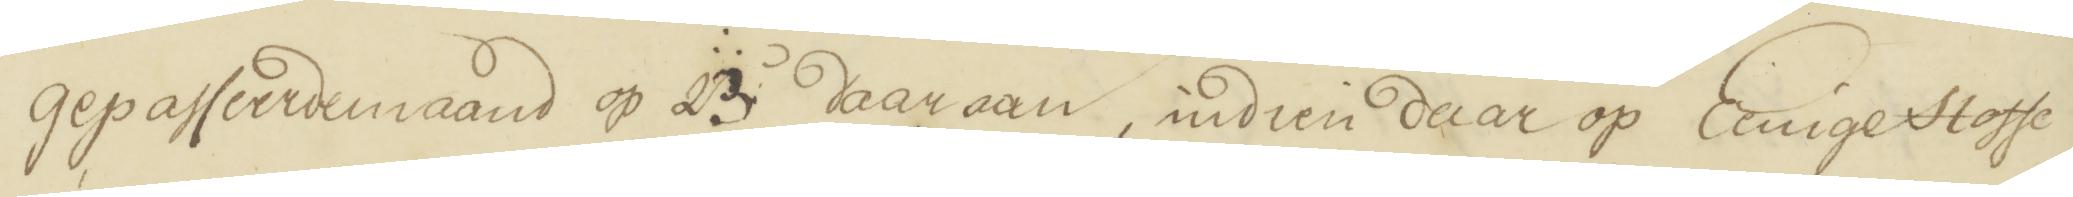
gepasseerde maand op 23:'' daar aan, indien daar op Eenige stoffe
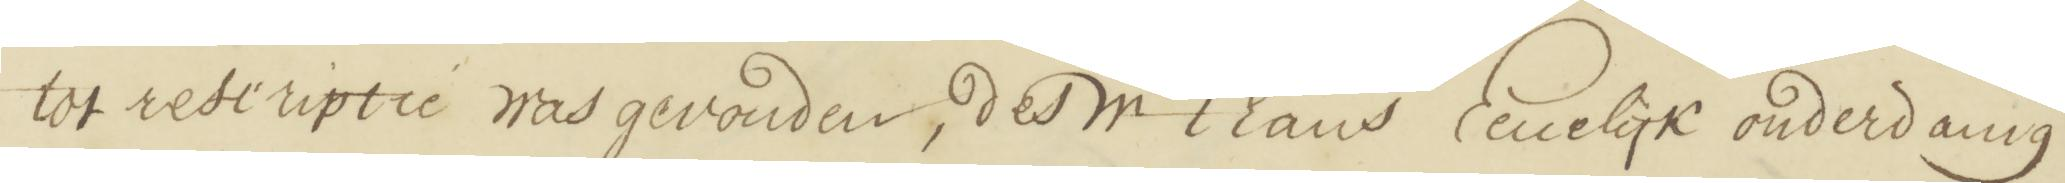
tot rescriptie was gevonden, des w thans Eenelijk onderdanig
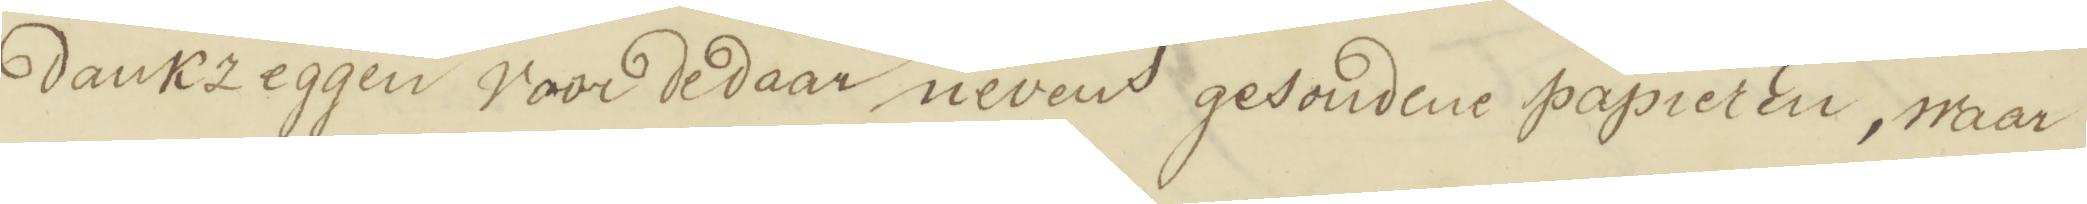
dankzeggen voor de daar nevens gesondene papieren, waar
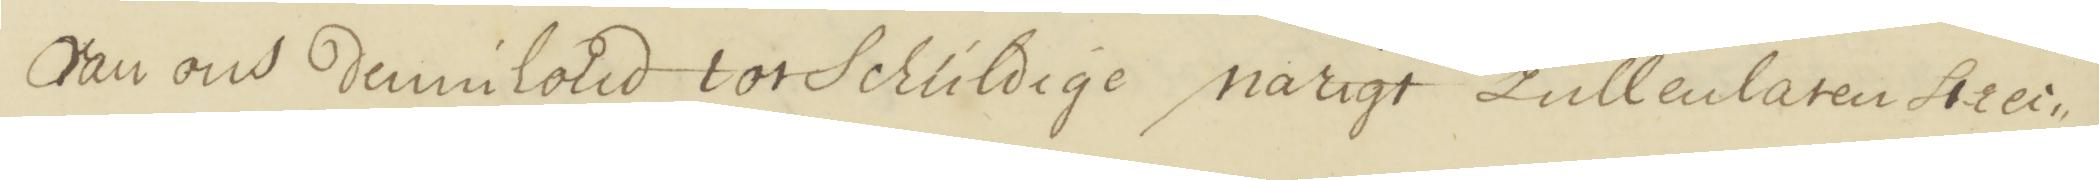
van ons den inhoud tot schuldige narigt zullen laten strec„
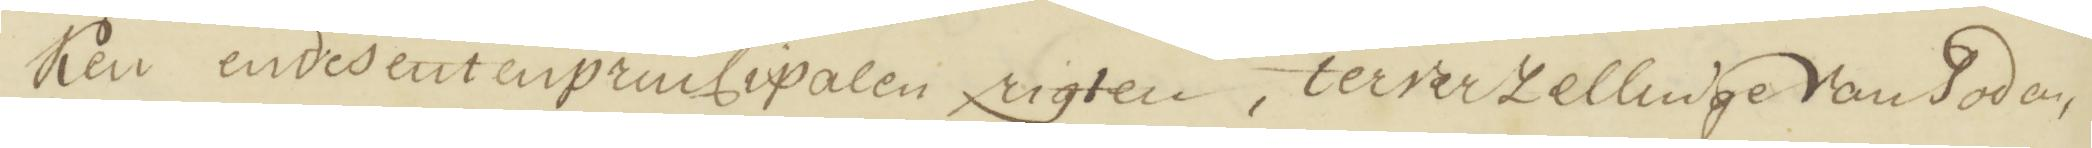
ken en desenten principalen rigten, ter verzellinge van Soda„
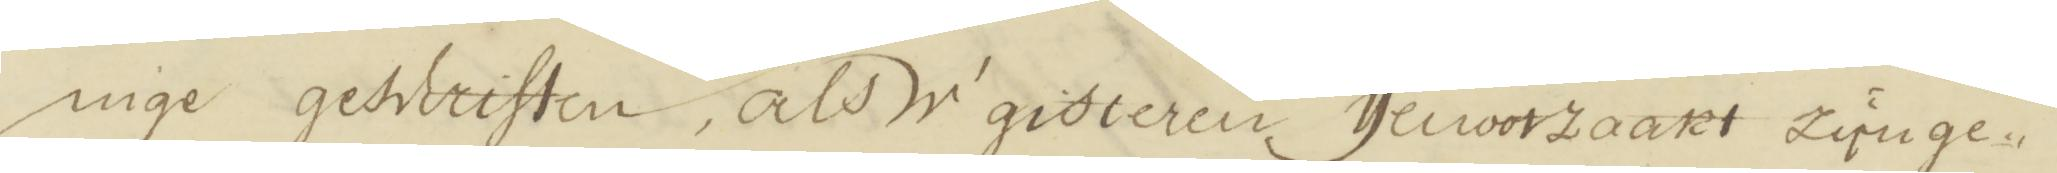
inge geschriften, als w' gisteren genootzaakt zijn ge„
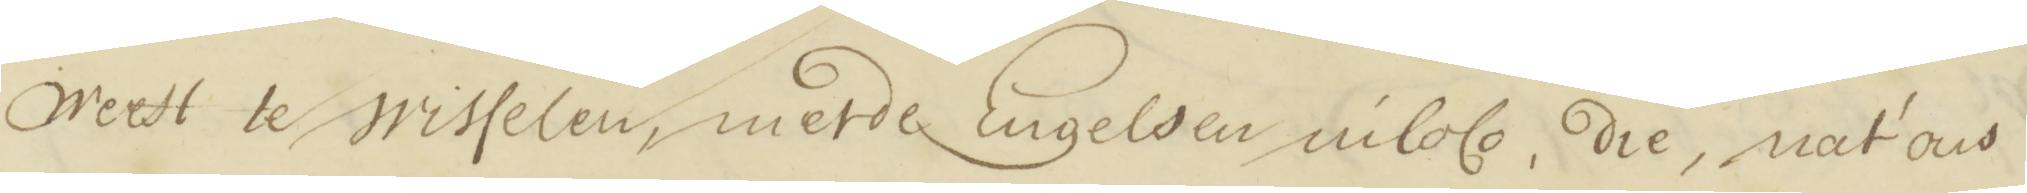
weest te wisselen, met de Engelsen in loco, die, nat' ons
